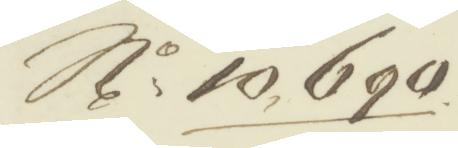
N:o 10,690
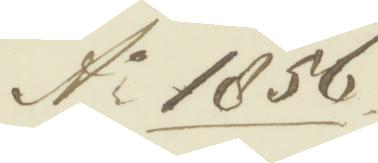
A:o 1856
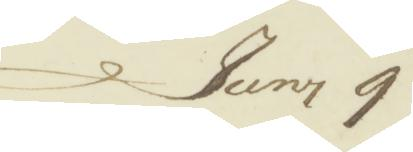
Juny 9
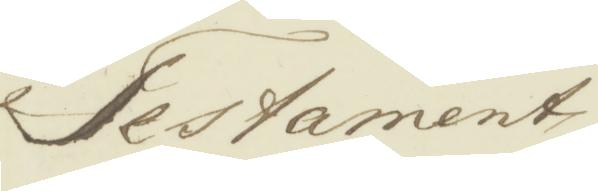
Testament,
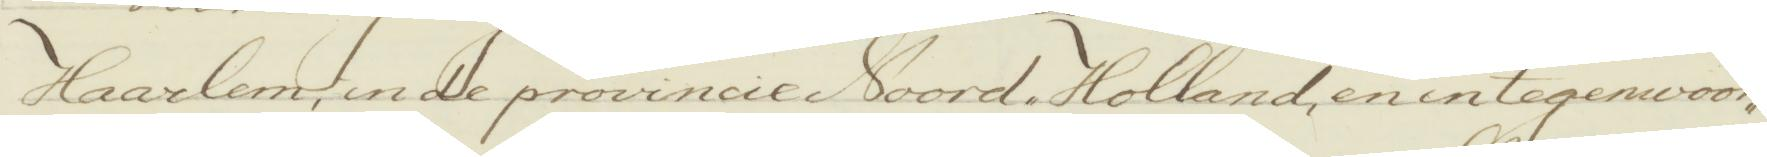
Haarlem, in de provincie Noord„Holland, en in tegenwoor„
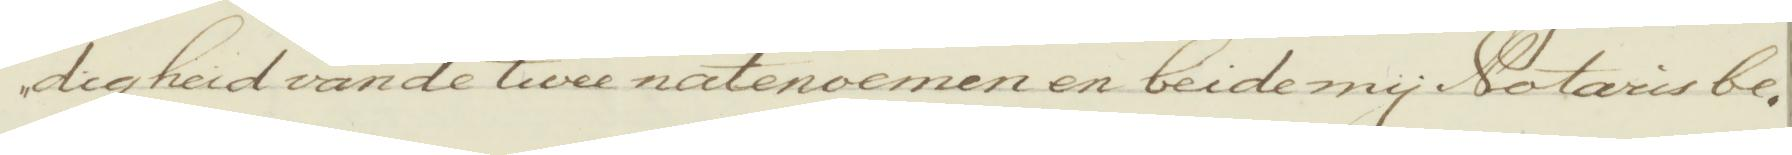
„digheid van de twee natenoemen en beide mij Notaris be„
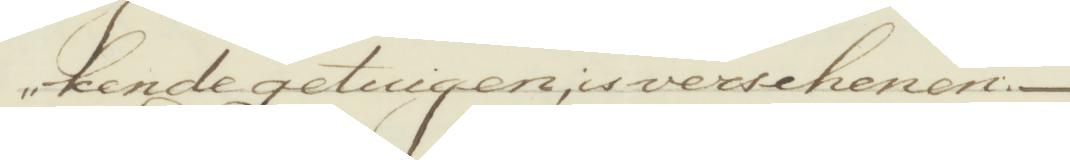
„kende getuigen, is verschenen:—
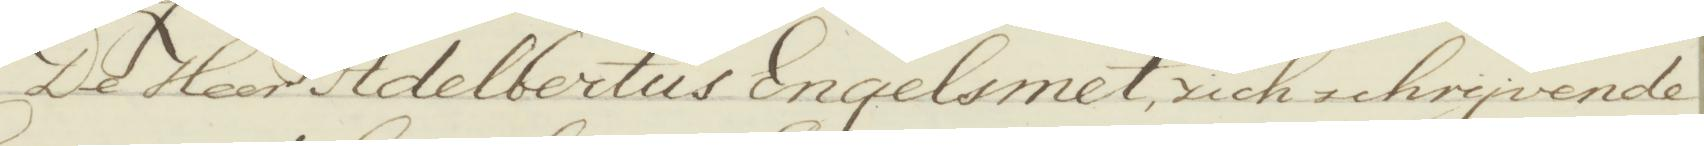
De Heer Adelbertus Engelsmet, zich schrijvende
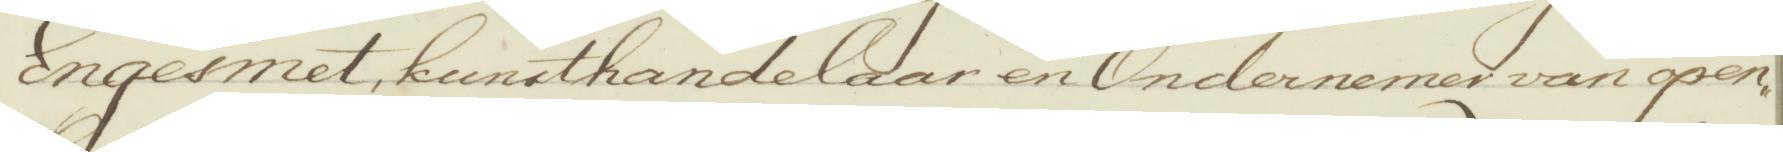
Engesmet, kunsthandelaar en Ondernemer van open„
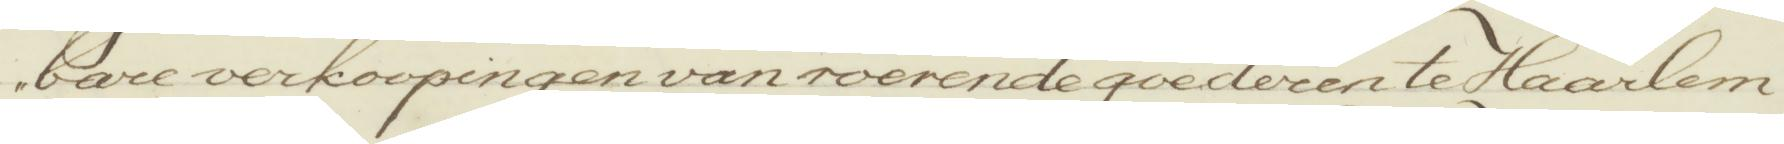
„bare verkoopingen van roerende goederen te Haarlem
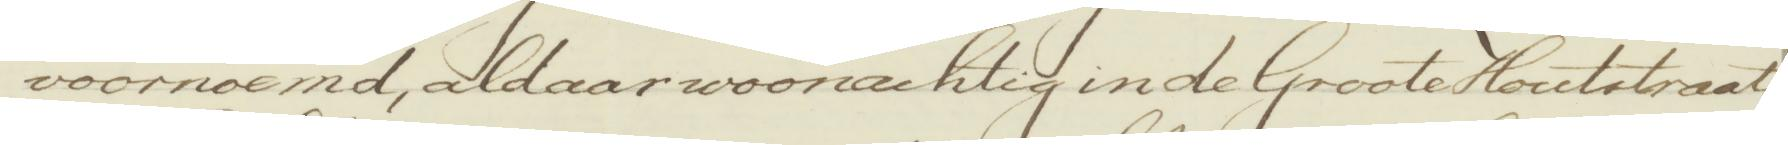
voornoemd, aldaar woonachtig in de Groote Houtstraat
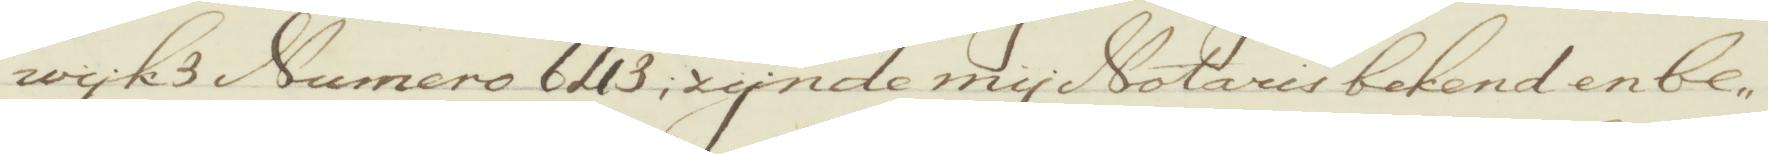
wijk 3 Numero 643; zijnde mij Notaris bekend en be„
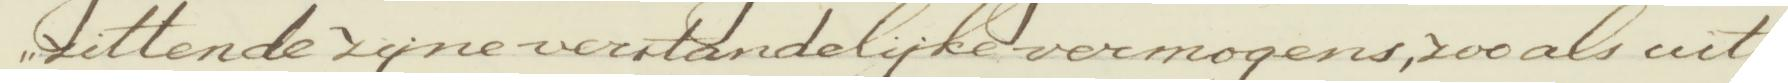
„zittende zijne verstandelijke vermogens, zooals uit
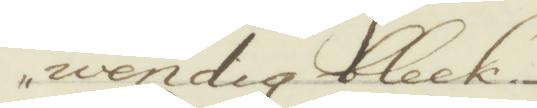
„wendig bleek
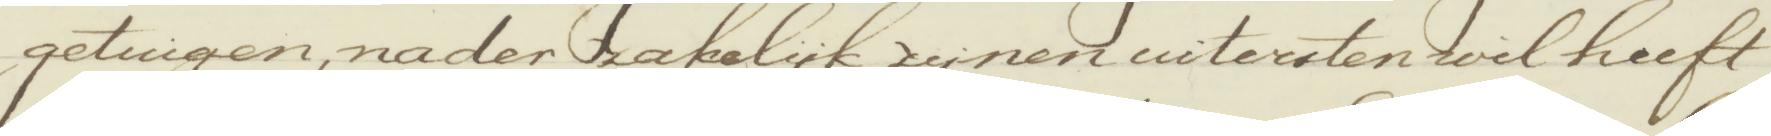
getuigen, nader zakelijk zijnen uitersten wil heeft
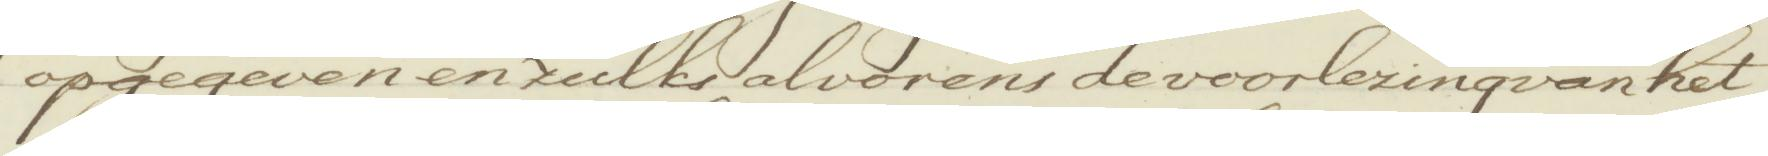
opgegeven en zulks alvorens de voorlezing van het
